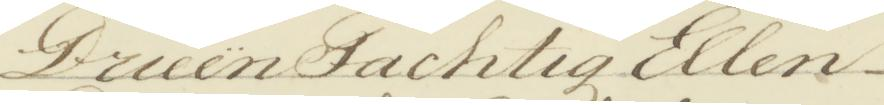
Drieën Tachtig Ellen
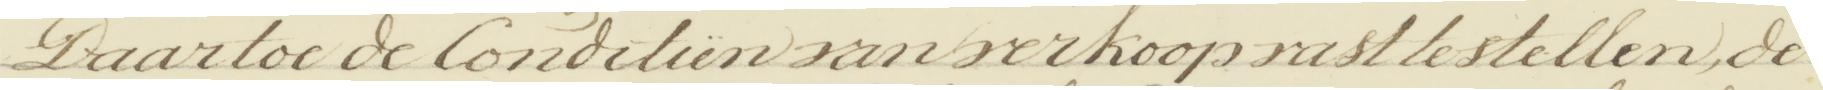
Daartoe de Conditiën van verkoop vast te stellen, de
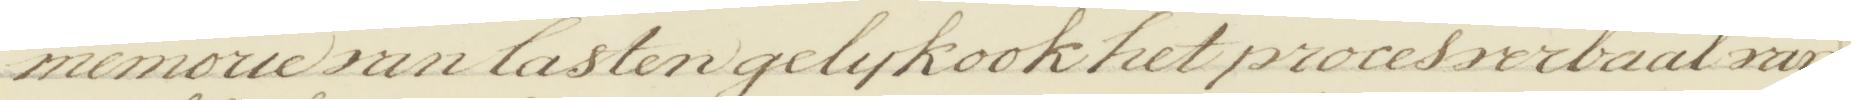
memorie van lasten gelyk ook het procesverbaal van
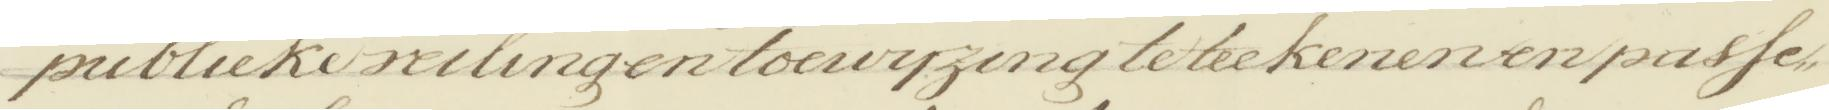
publieke veiling en toewyzing te teekenen en passe„
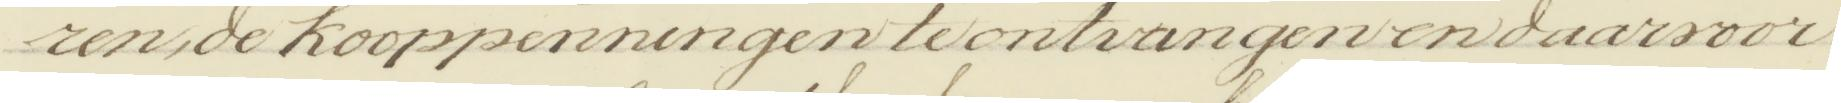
ren, de kooppenningen te ontvangen en daarvoor
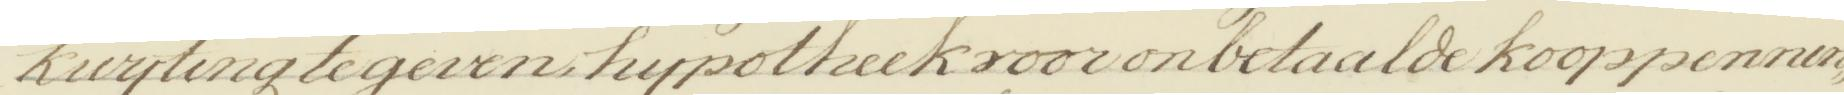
kwyting te geven, hypotheek voor onbetaalde kooppennin„
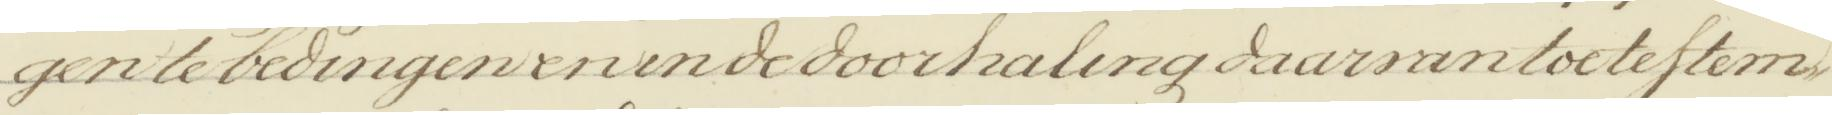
gen te bedingen en in de doorhaling daarvan toe te stem„
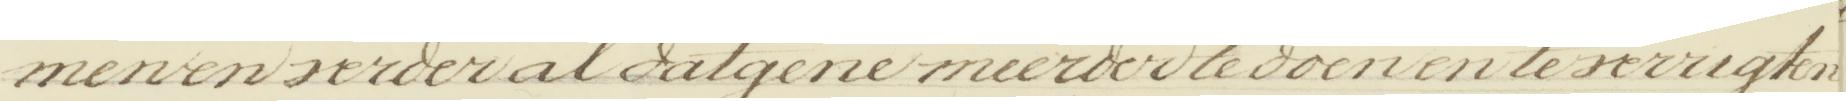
men en verder al datgene meerder te doen en te verrigten
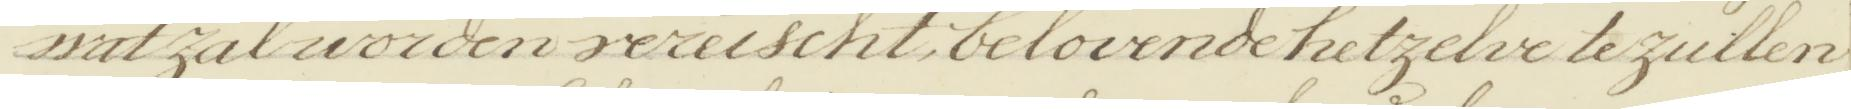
wat zal worden vereischt, belovende hetzelve te zullen
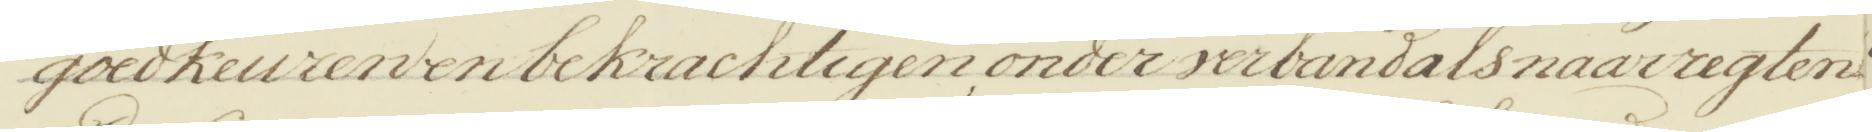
goedkeuren en bekrachtigen, onder verband als naar regten.
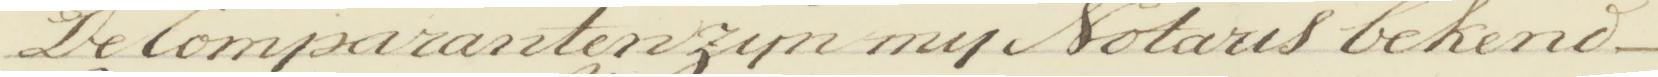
De Comparanten zyn my Notaris bekend-
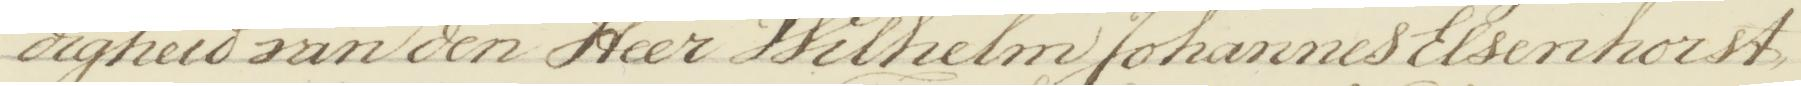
digheid van den Heer Wilhelm Johannes Elsenhorst„
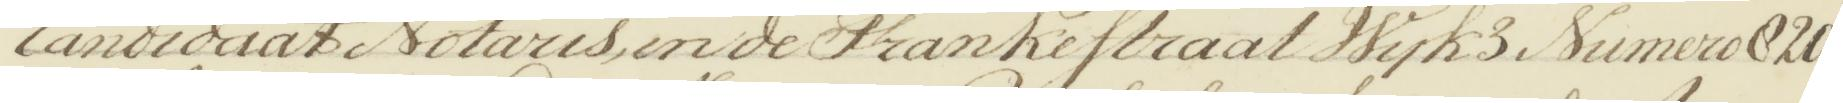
Candidaat Notaris, in de Frankestraat Wyk 3 Numero 820
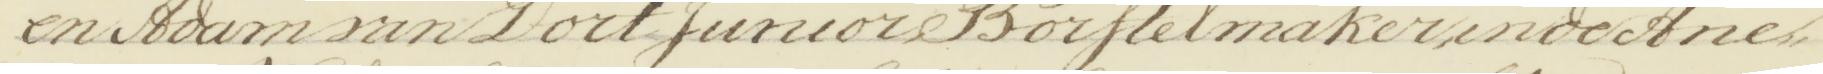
en Adam van Dort Junior Borstelmaker, in de Ane„
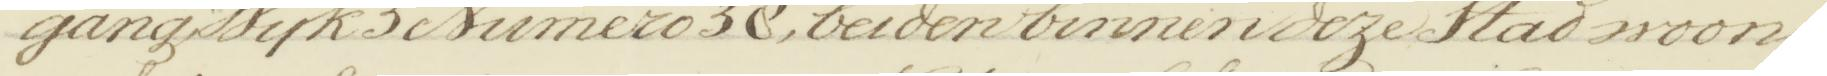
gang Wyk 3 Numero 38, beiden binnen deze Stad woon
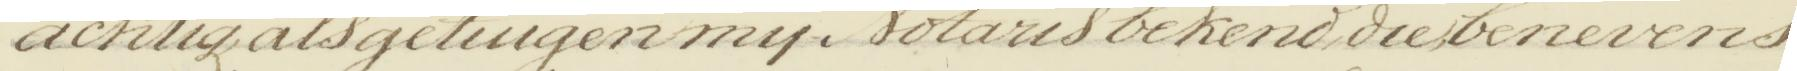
achtig, als getuigen my Notaris bekend, die benevens
